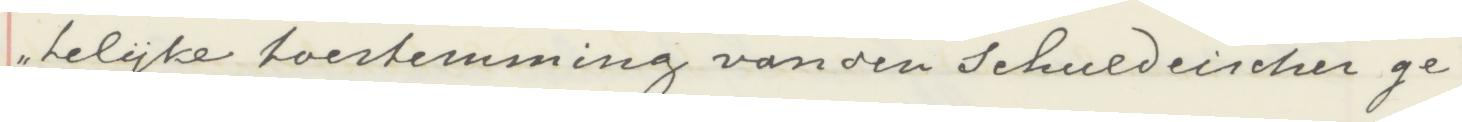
„telijke toestemming van den schuldeischer ge
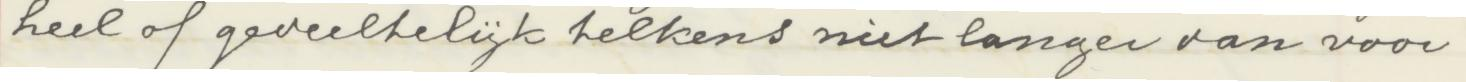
heel of gedeeltelijk telkens niet langer dan voor
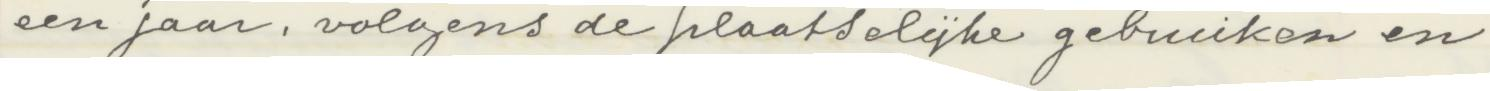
een jaar, volgens de plaatselijke gebruiken en
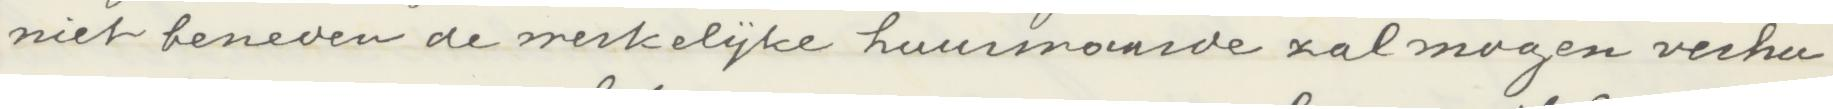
niet beneven de werkelijke huurwaarde zal mogen verhu
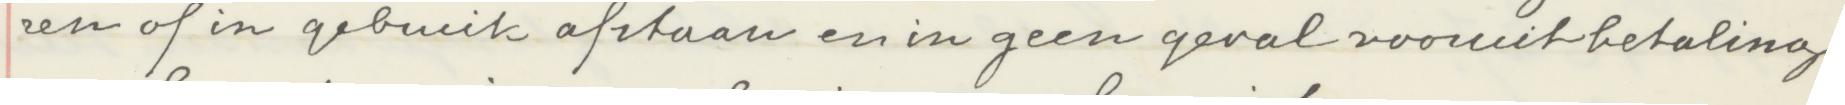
ren of in gebruik afstaan en in geen geval vooruit betaling
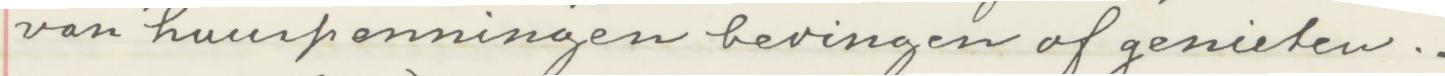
van huurpenningen bedingen of genieten.
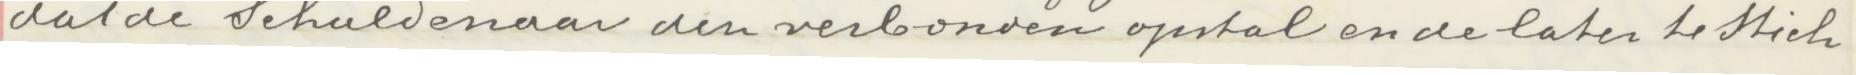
dat de schuldenaar den verbonden opstal en de later te stich
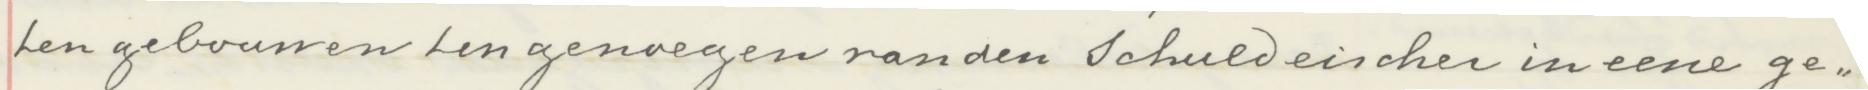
ten gebouwen ten genoegen van den schuldeischer in eene ge„
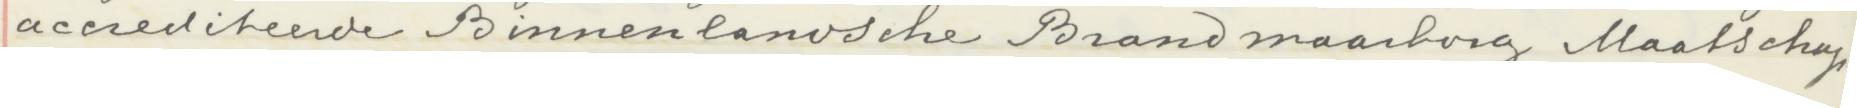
accrediteerde Binnenlandsche Brandwaarborg Maatschap
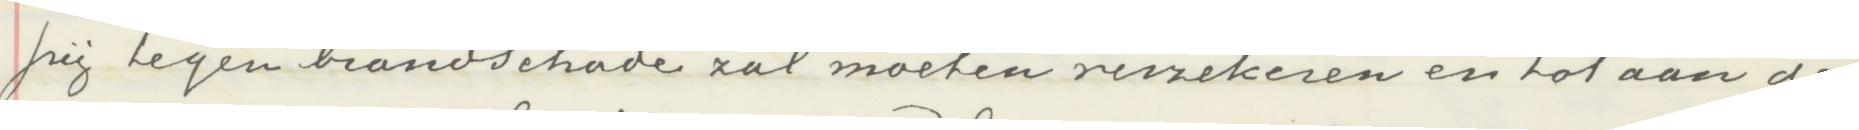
pij tegen brandschade zal moeten verzekeren en tot aan de
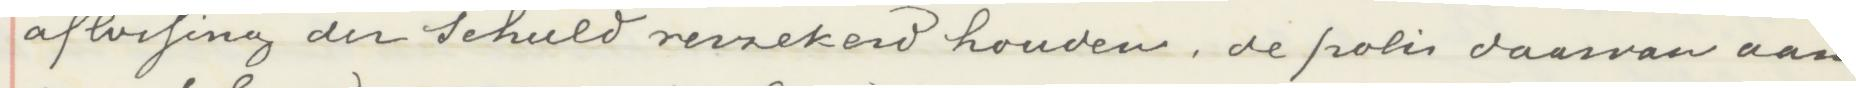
aflossing der schuld verzekerd houden, de polis daarvan aan
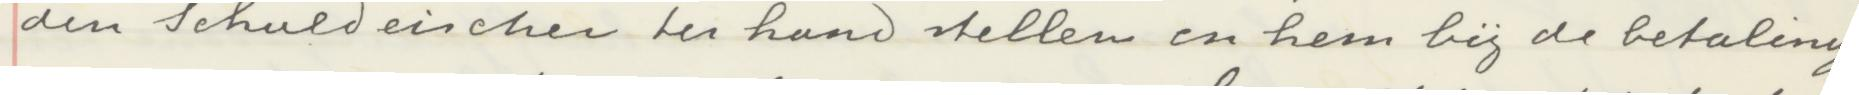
den schuldeischer ter hand stellen en hem bij de betaling
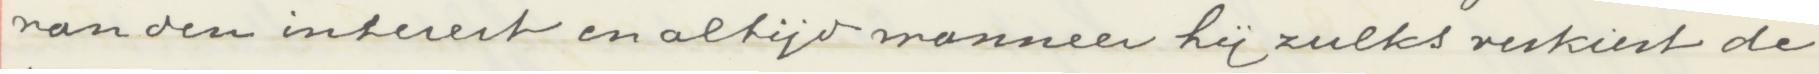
van den interest en altijd wanneer hij zulks verkiest de
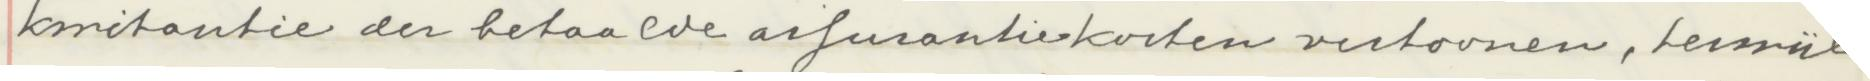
kwitantie der betaalde assurantiekosten vertoonen, terwijl
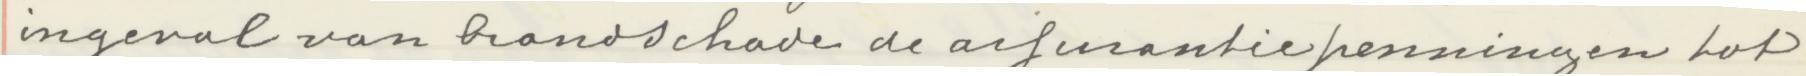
ingeval van brandschade de assurantiepenningen tot
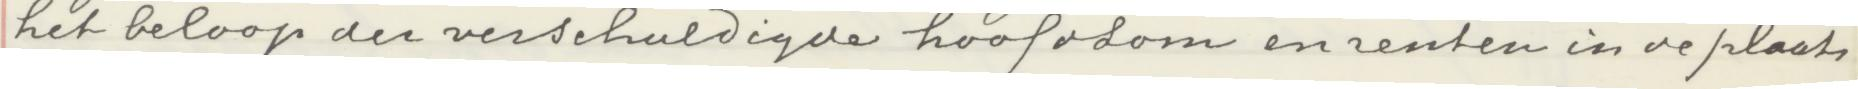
het beloop der verschuldigde hoofdzom en renten in de plaats
